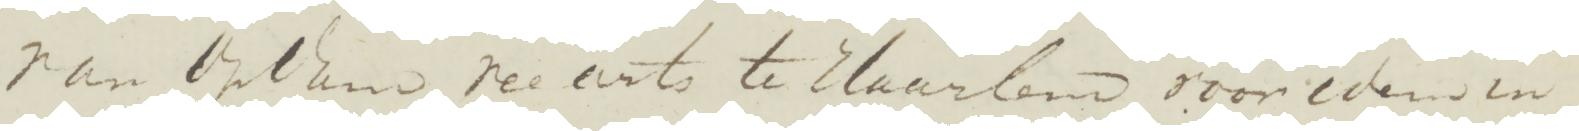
van Opdien veearts te Haarlem voor idem in
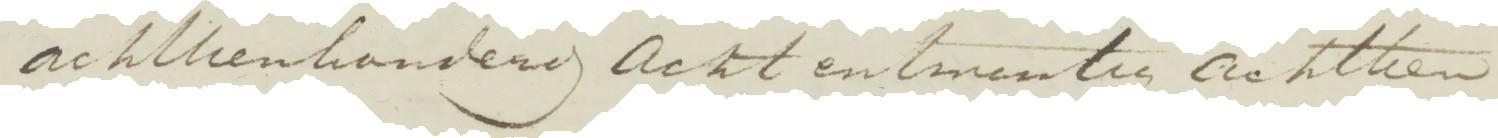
achttienhonderd Acht en twintig achttien
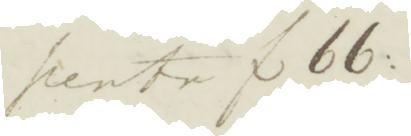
pertr ƒ 66:
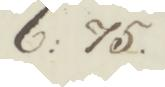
6: 75.
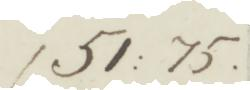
151:75.
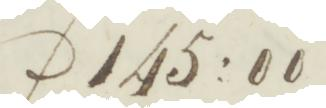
ƒ 145:00
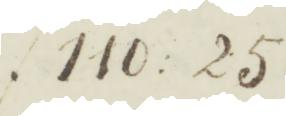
ƒ110: 25
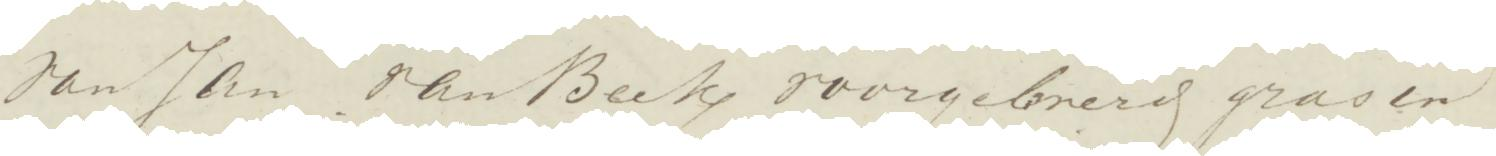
van Jan van Beek voorgeleverd gras en
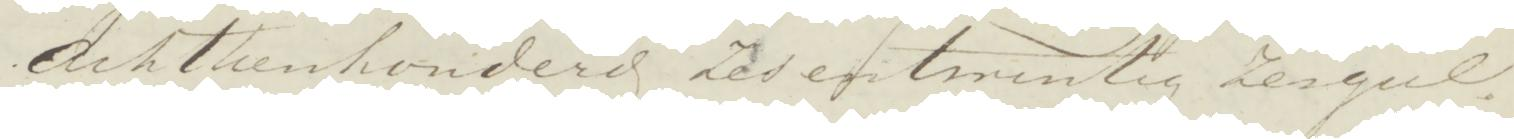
achttienhonderd zes en twintig zes gul
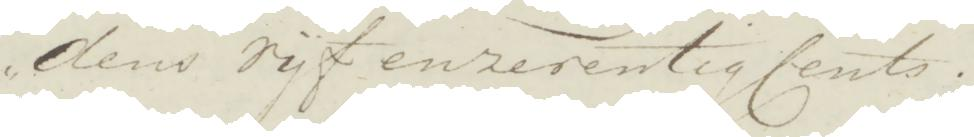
„dens vijf en zeventig Cents.
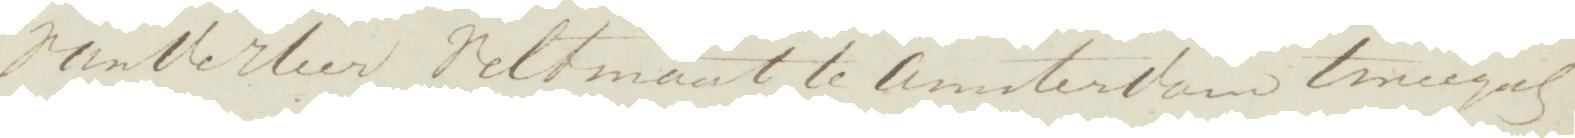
van de Heer Veltmaat te Amsterdam tweegul
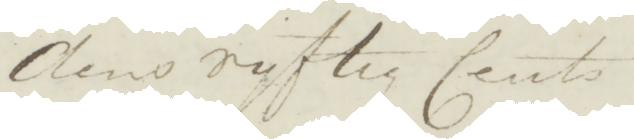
dens vijftig Cents
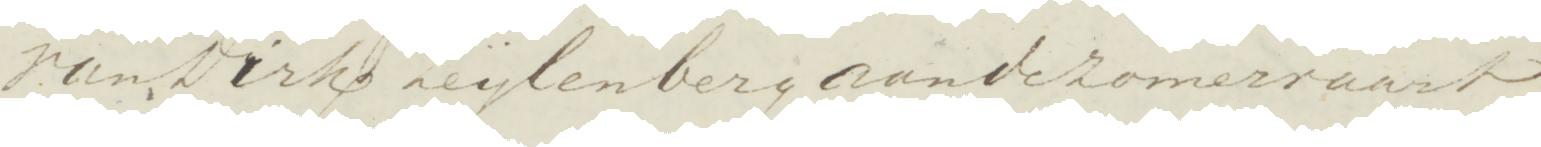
van Dirk Zeijlenberg aan de zomervaart
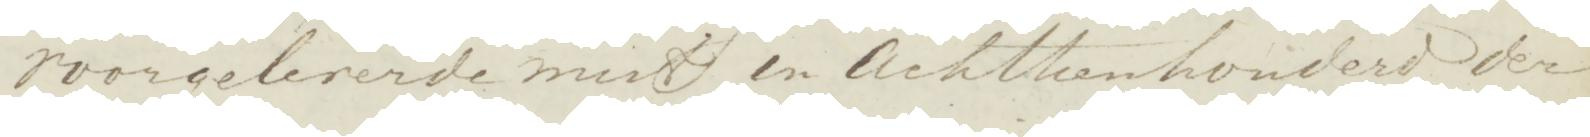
voorgeleverde mest en Achttienhonderd der
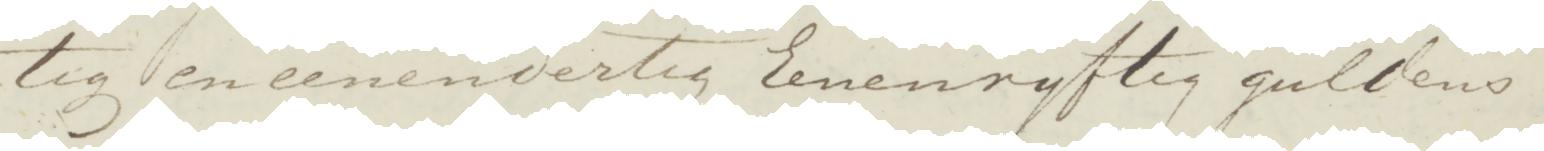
tig en eenendertig Eenen vyftig guldens
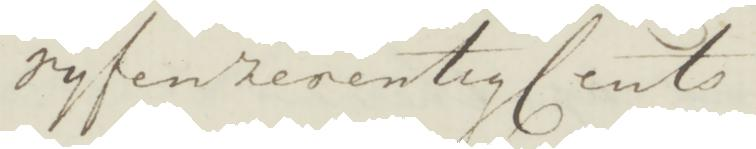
vyfenzeventig Cents
